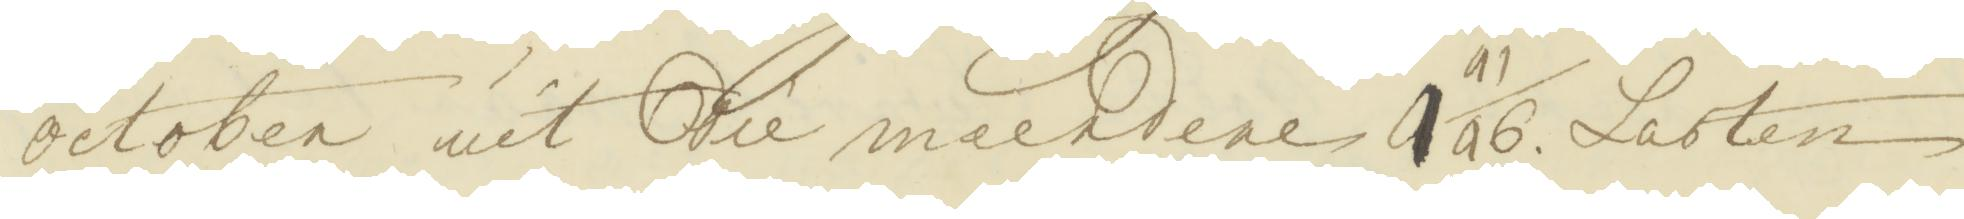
october uit die meerdere 4 41/46. Lasten
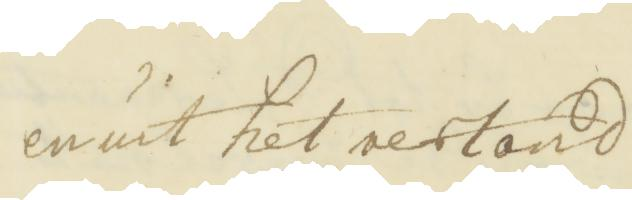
en uit het restand
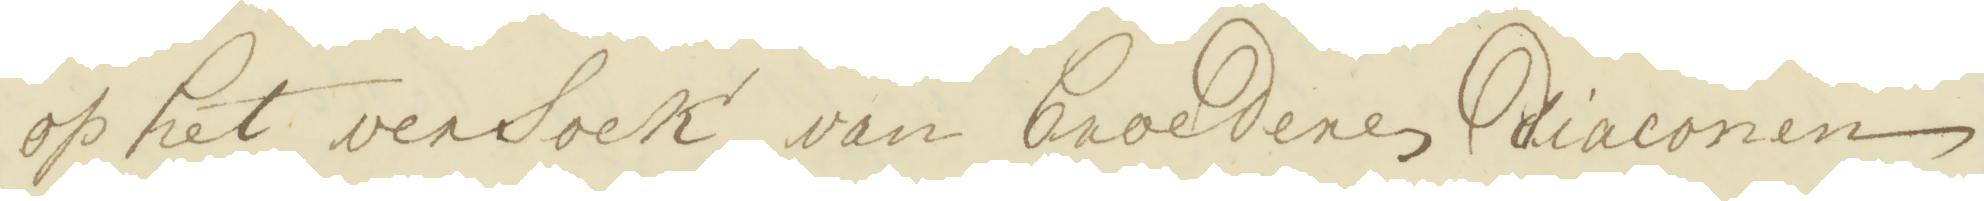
op het versoek van broederen diaconen
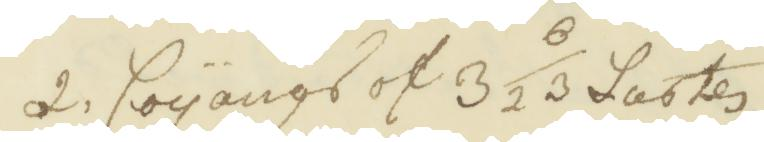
2. Coijangs of 3 6/23 Lasten
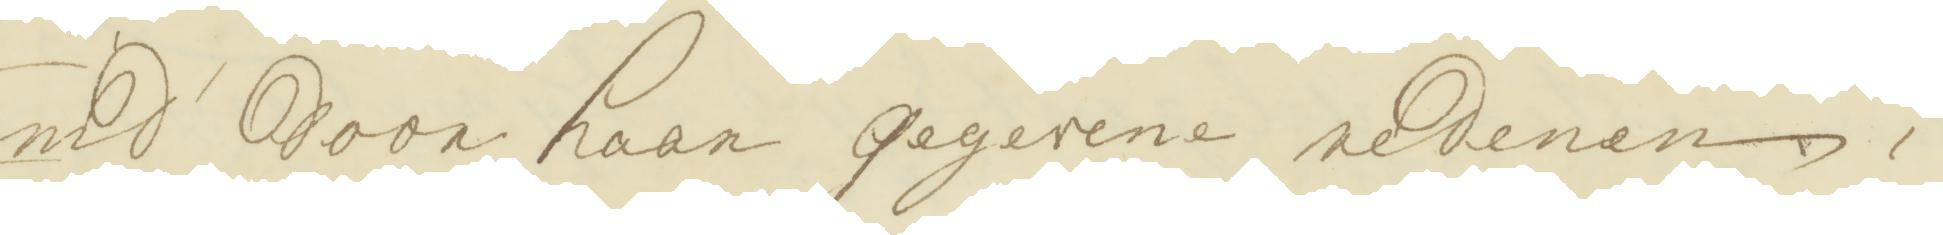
om d’ door haar gegevene redenen,
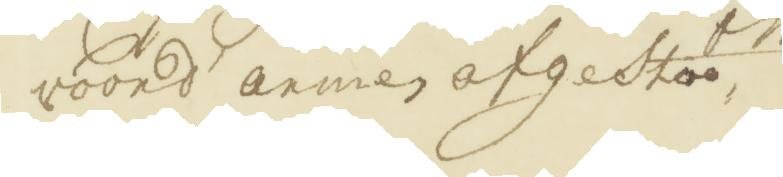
voor d' armen afgestoo„
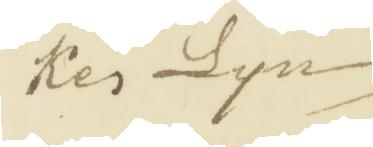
ken Syn
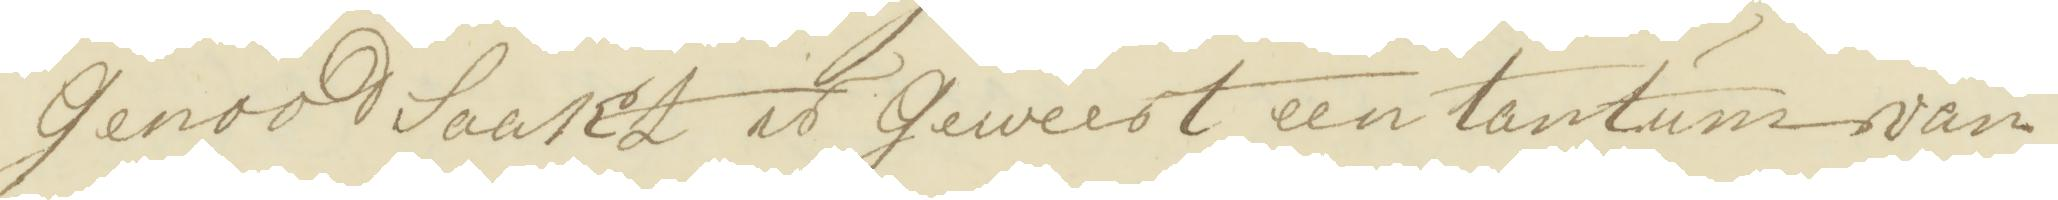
genoodsaakt is geweest een tantum van
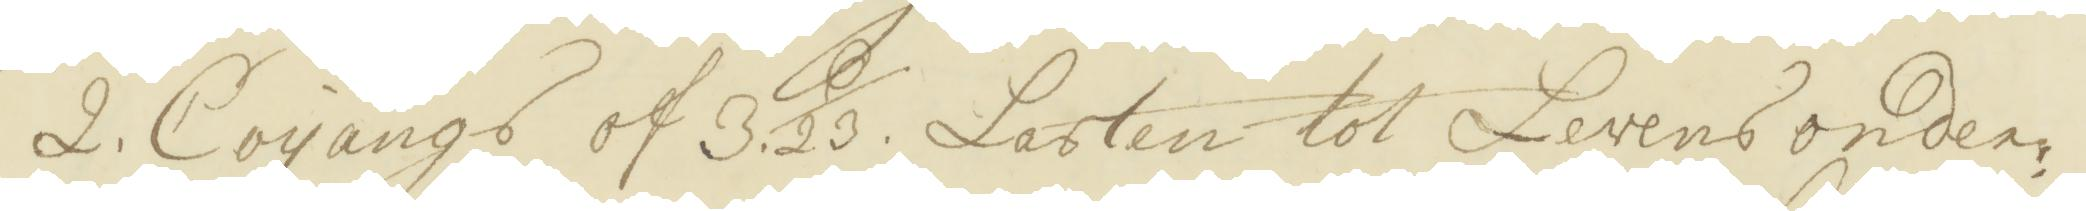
2. Coijangs of 3 6/23. Lasten tot Levens onder„
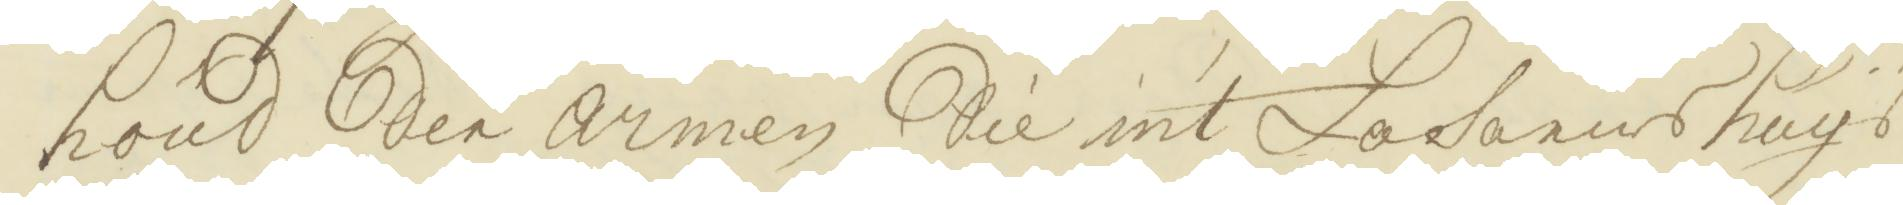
houd der armen die in't Lasarus huijs
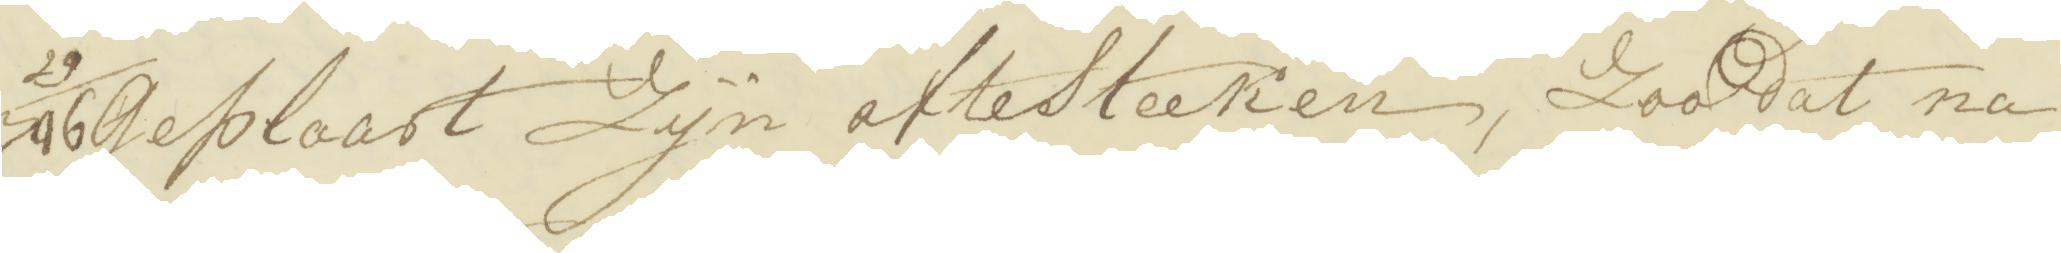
geplaast Zijn af te steeken, Zoodat na
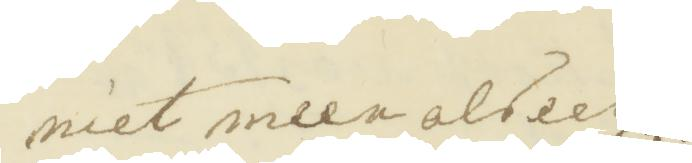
niet meer als een 29/46
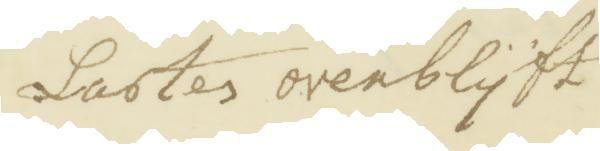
Lasten overblijft
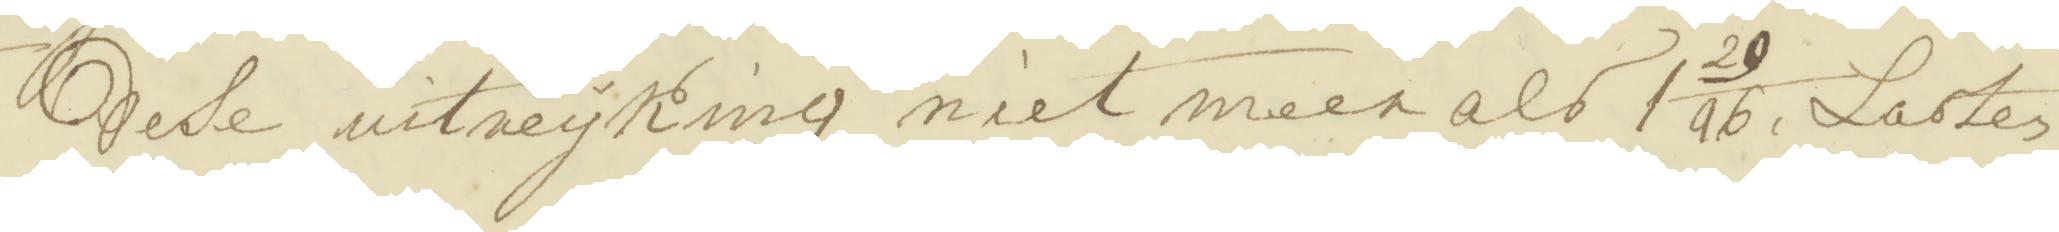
dese uitreijking niet meer als 1 29/46, Lasten
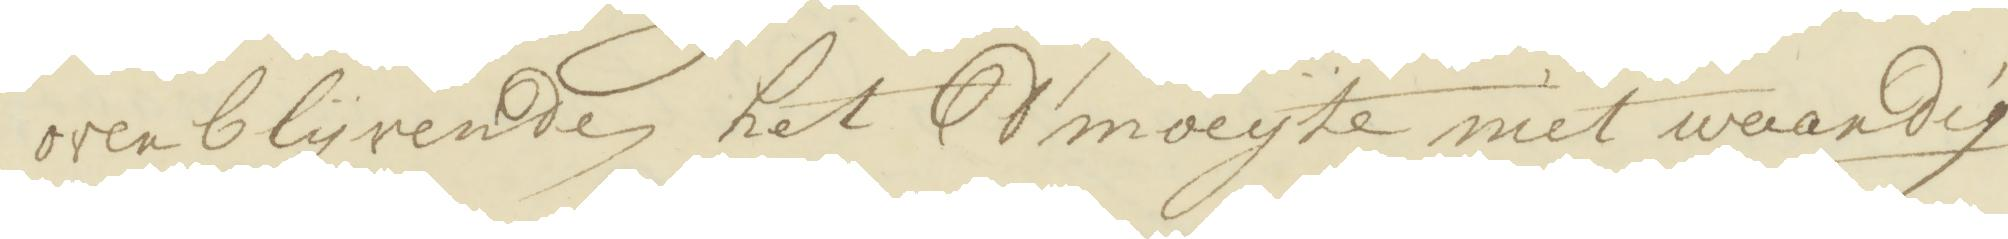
over blijvende het d'moeijte niet waardig
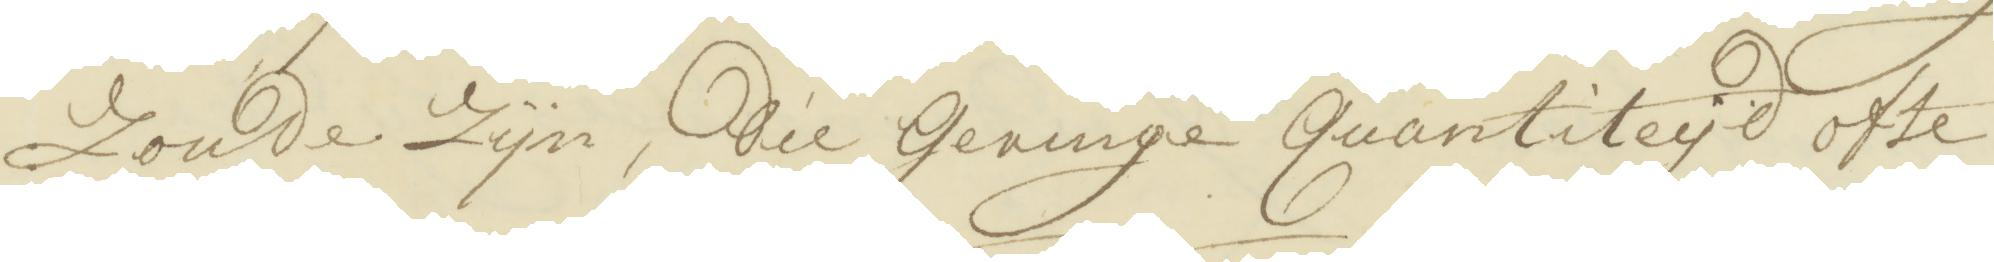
Zoude Zijn, die geringe quantiteijd of te
